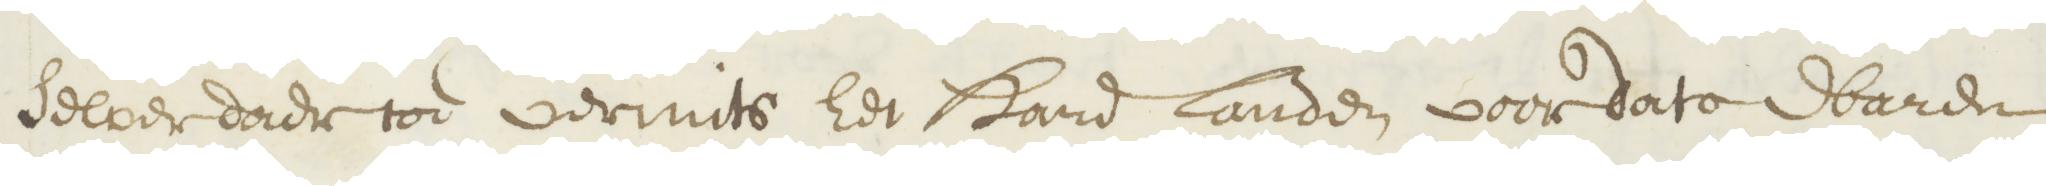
selver daer toe vermits het Hare Landen voor dato waren
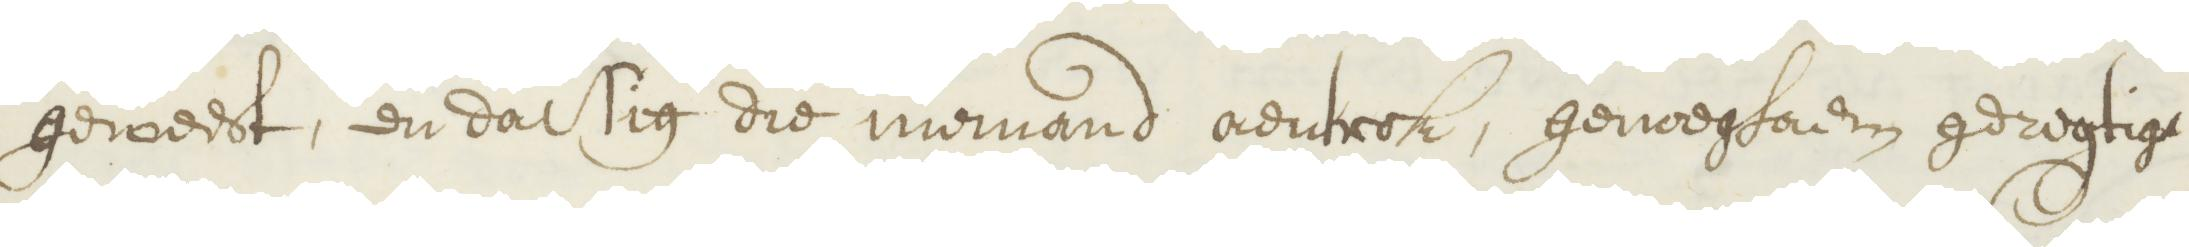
geweest, en dat Sig die niemand aentrok, genoegsaem geregtigt
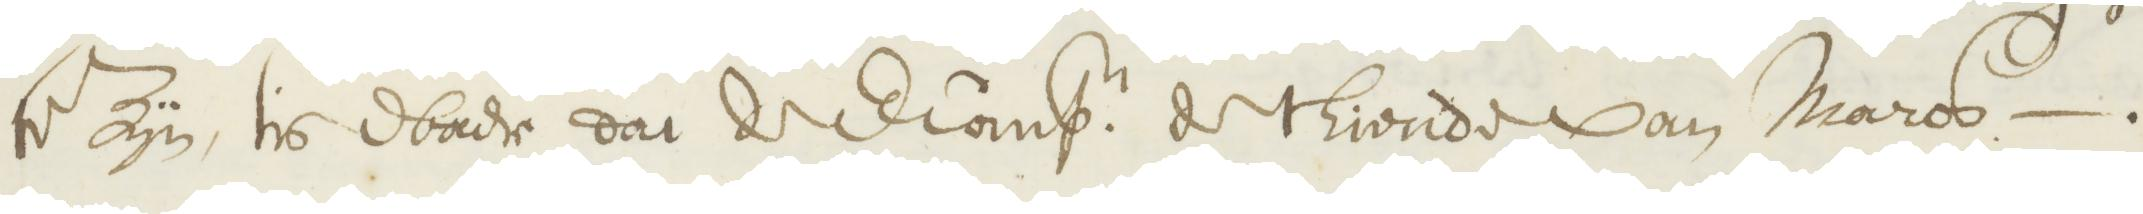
te zijn, tis waer dat de EComp:e de thiende van Maros —.
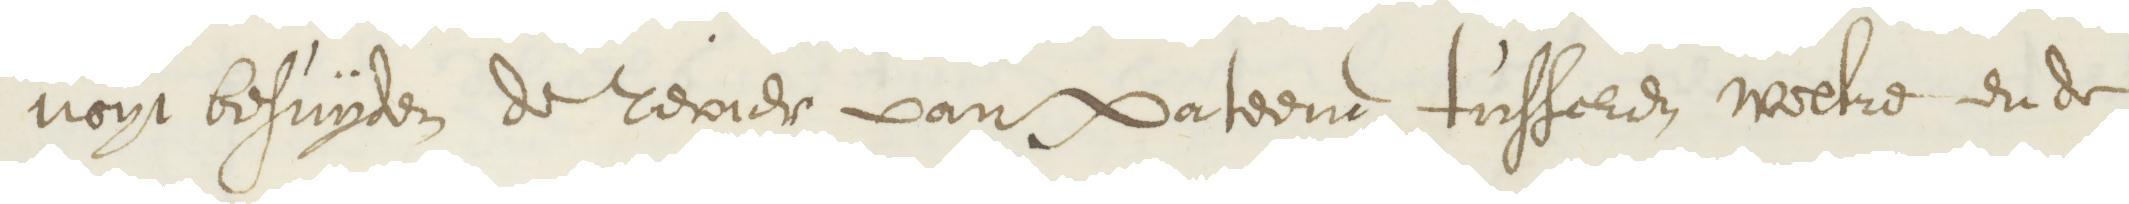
noijt besuijden de revier van Pateene tusschen welke en de
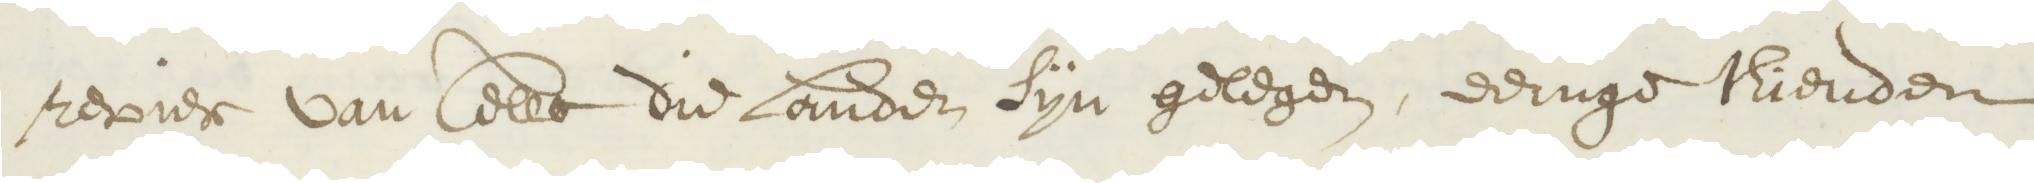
revier van Telle die landen Sijn gelegen, eenige thienden
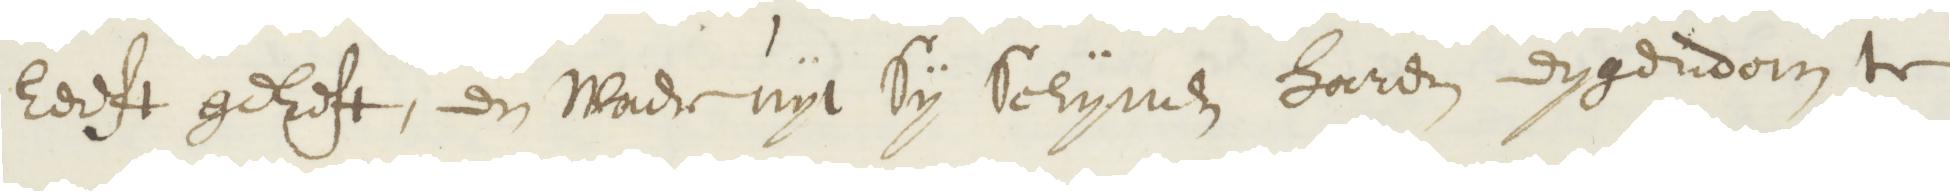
heeft geheft, en waer uijt Sij Schijnen haren eijgendom te
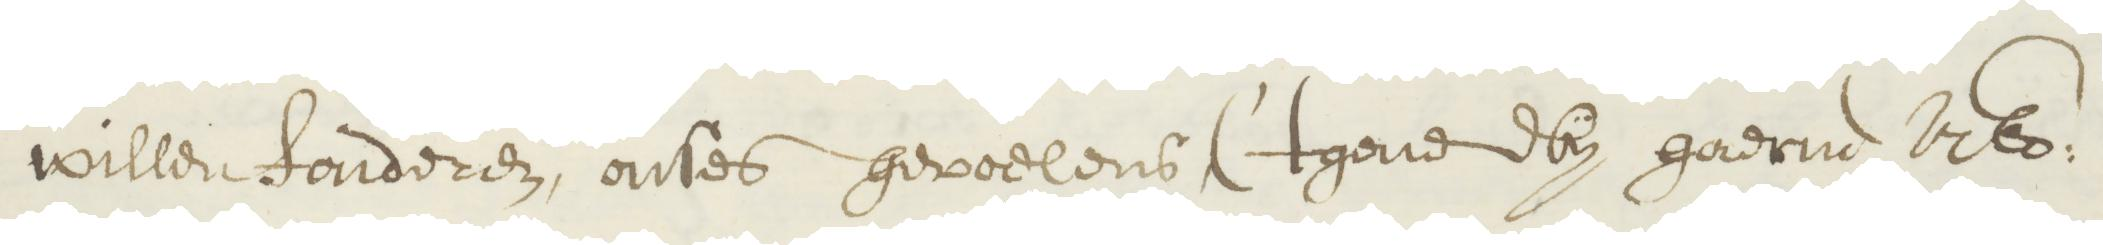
willen fonderen, onses gevoelens ( 'tgene wij gaerne uE:
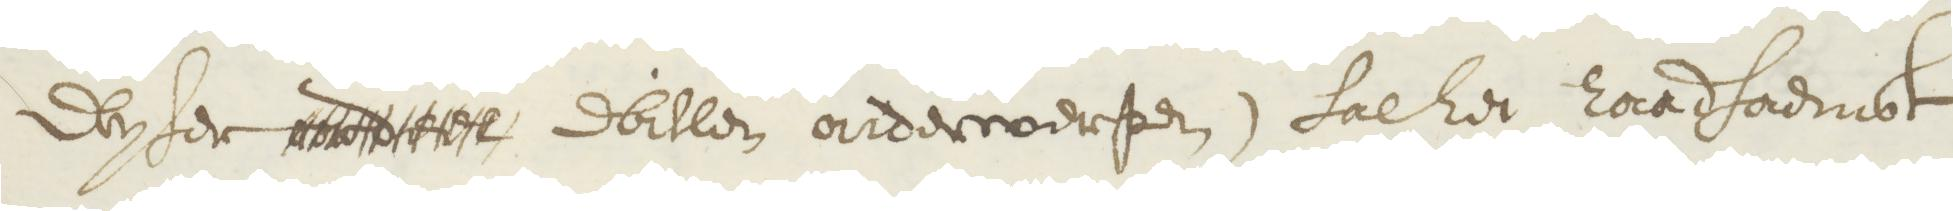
wijser, ordeel willen onderwerpen) Sal het raadsaemst
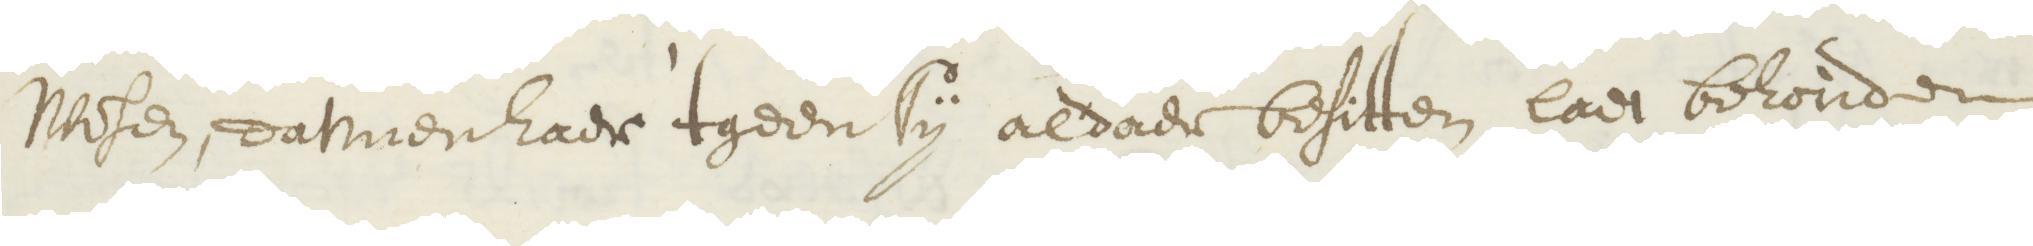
Wesen, datmen haer ’tgeen Sij aldaer besitten laet behouden,
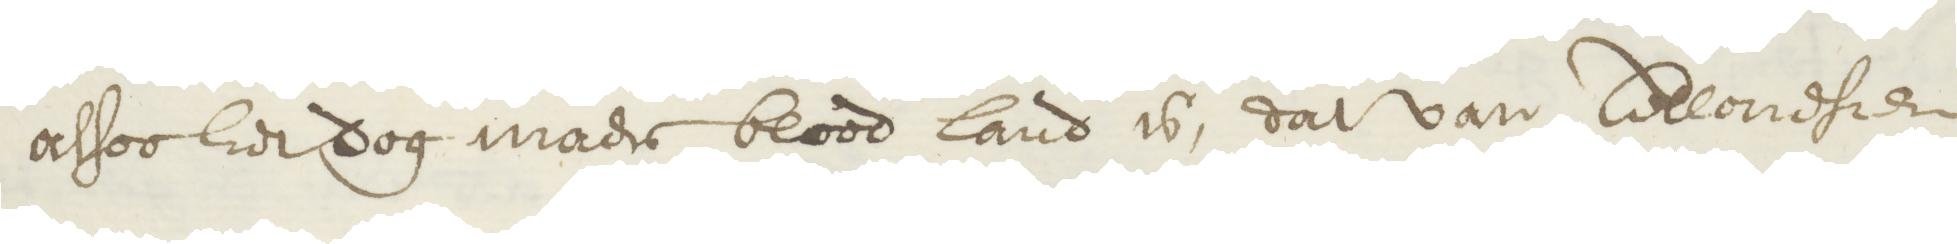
alsoo het dog maer blood land is, dat van Tellonesien
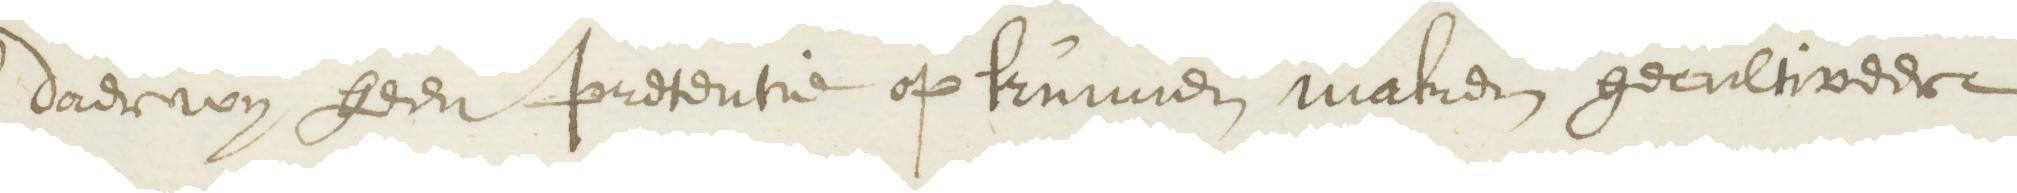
daerwij geen pretentie op kunnen maken gecultiveert
